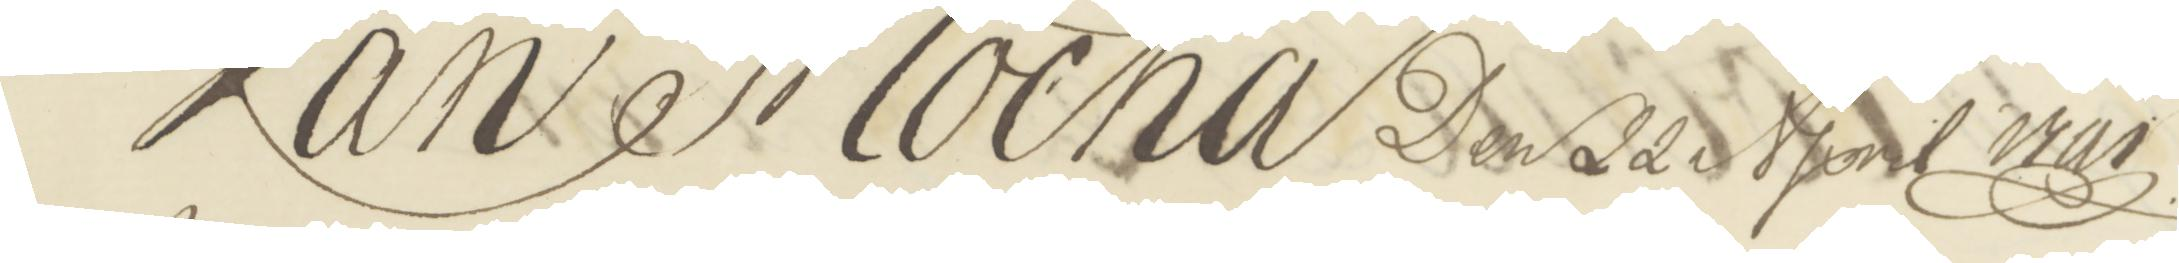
Van Mocha Den 22 April 1741
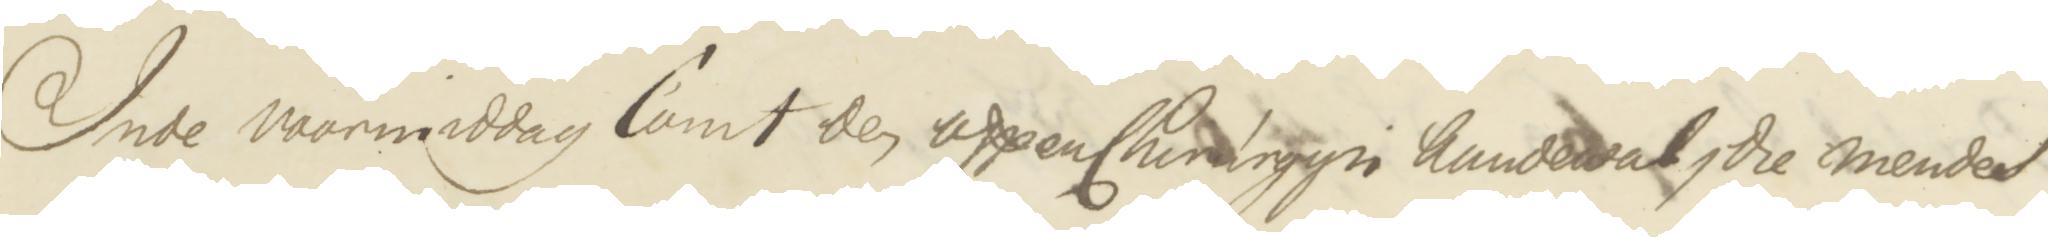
Inde voormiddag Comt den opperchirurgijn aan de wal, die men des
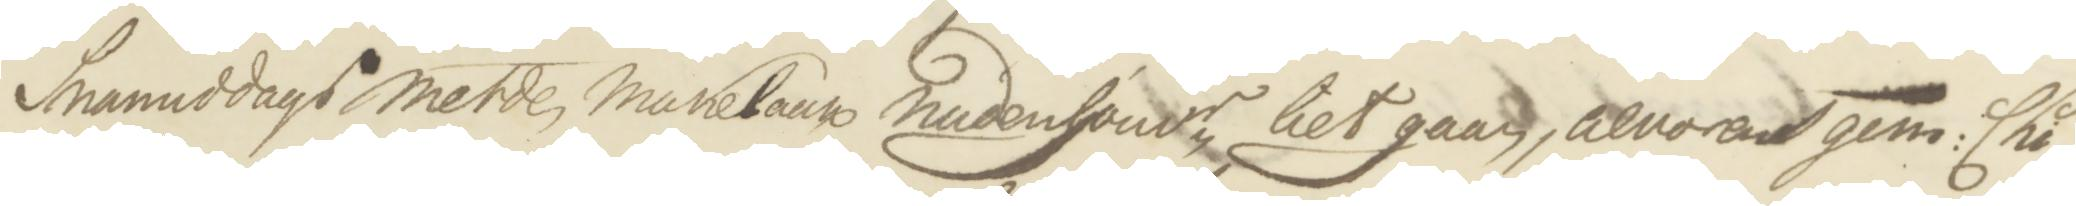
snamiddags met den makelaar na den Gouv„r liet gaan, alvorens gem: Chi
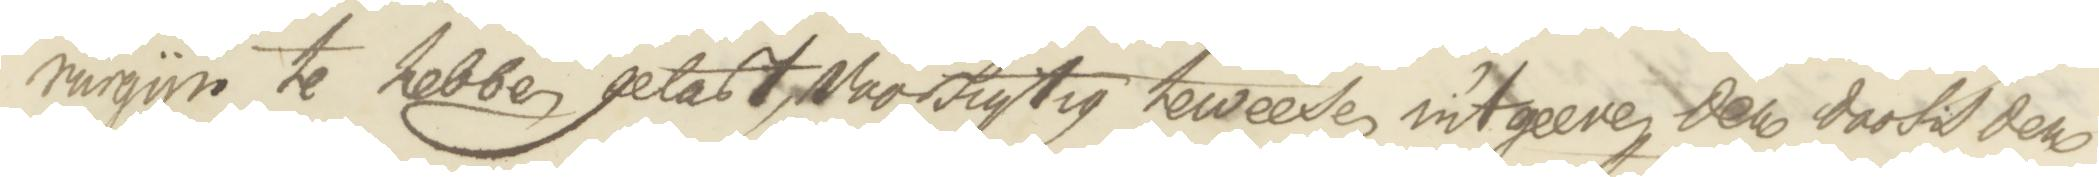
rurgijn te hebben gelast, voorsigtig teweesen in't geeven der doosis den
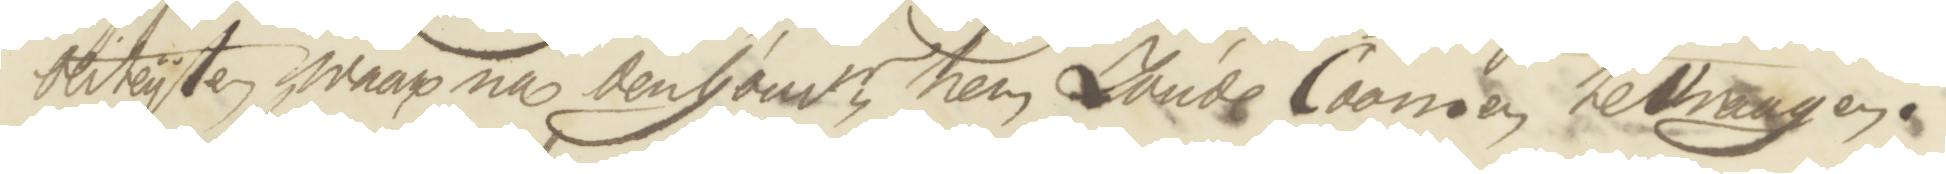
oliteijten, waar na den Gouv„r heren zoude Coomen te vraagen.
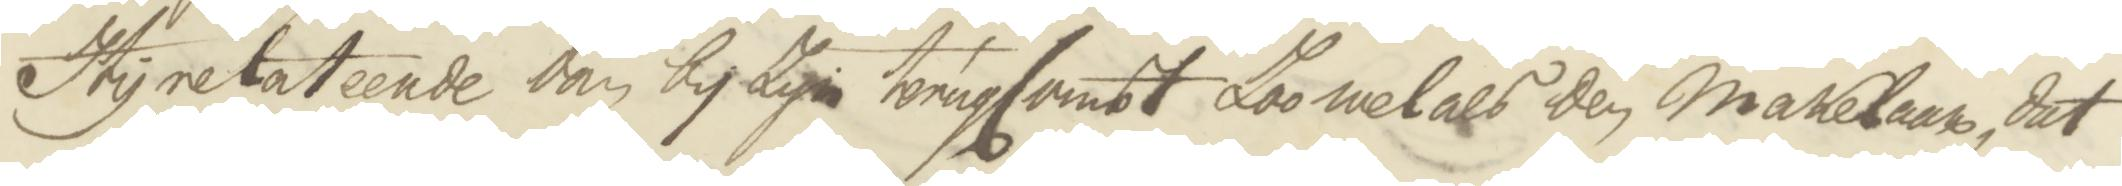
Hij relateerde dan bij zijn terugcomst zoo wel als den makelaar, dat
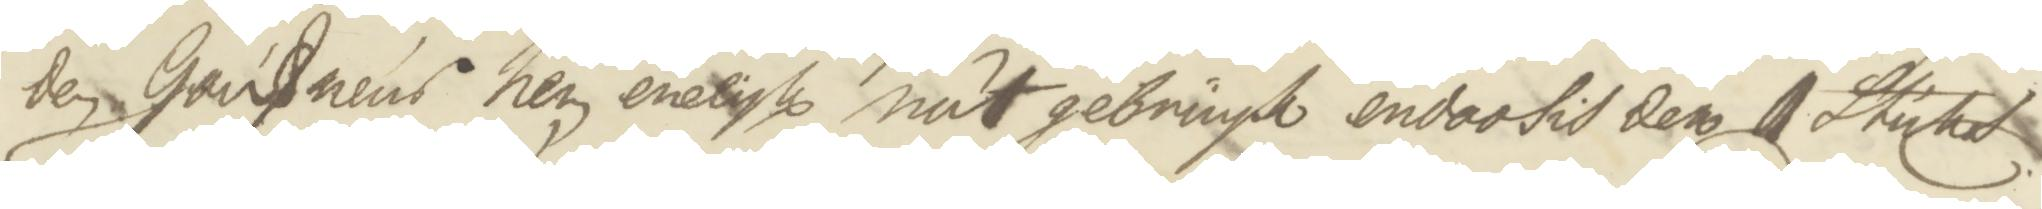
den Gouverneur hem enelijk na't gebruijk en doosis der 4 stuks
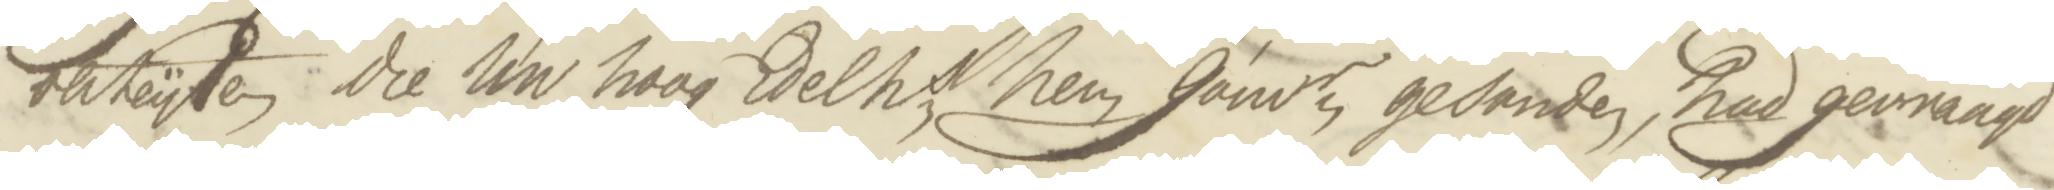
oliteijten die uw hoog Edelh„s hem Gouv„r gesonden, had gevraagd
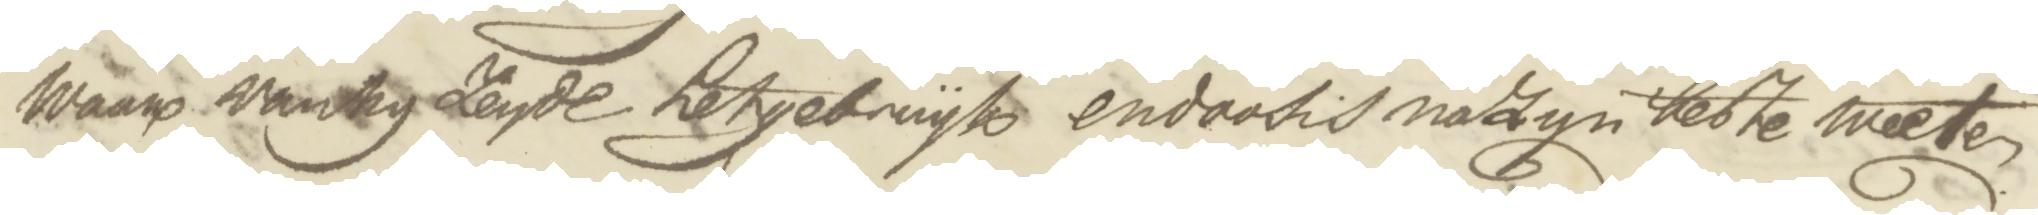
waar van hy zeijde het gebruijk en doosis na zyn beste weeten
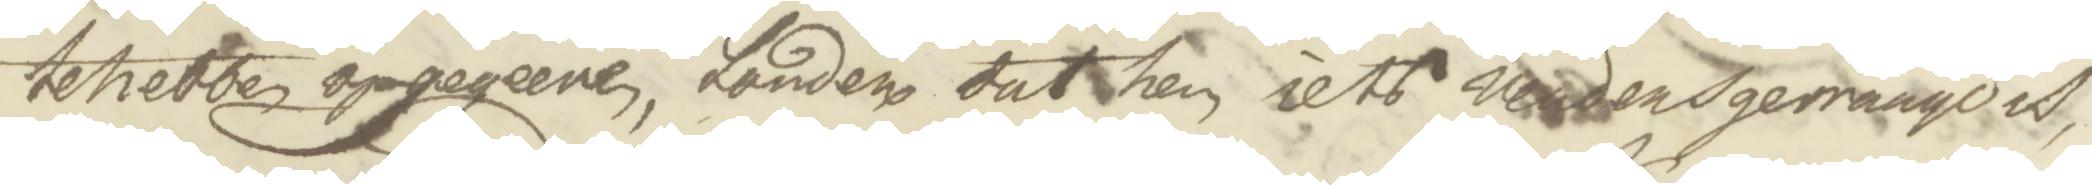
te hebben opgegeeven, sonder dat hem iets verders gevraagd is,
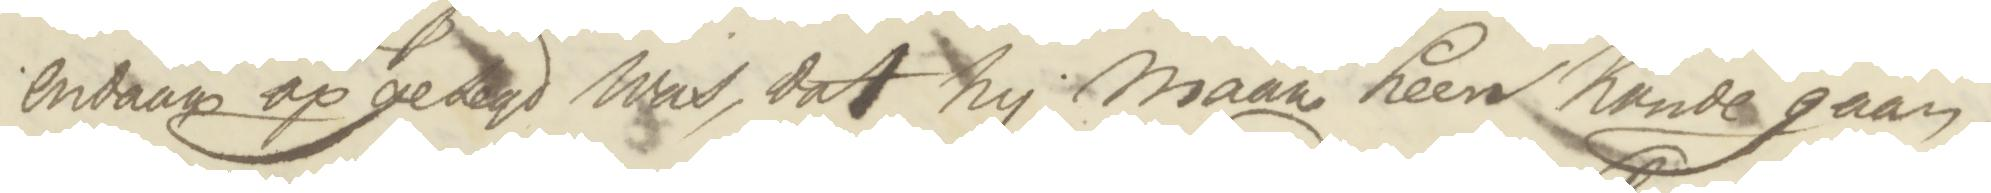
en daar op gezeyd was, dat hij maar heen konde gaan
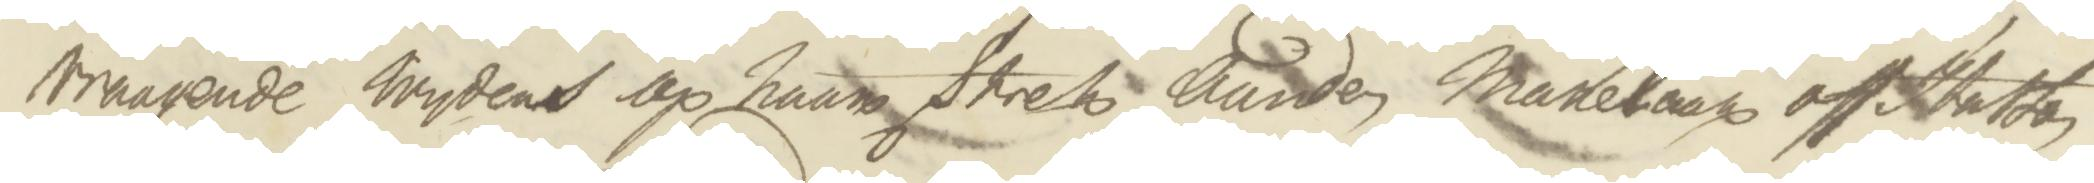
waarende wyders op haar vertrek aanden makelaar off Hassan
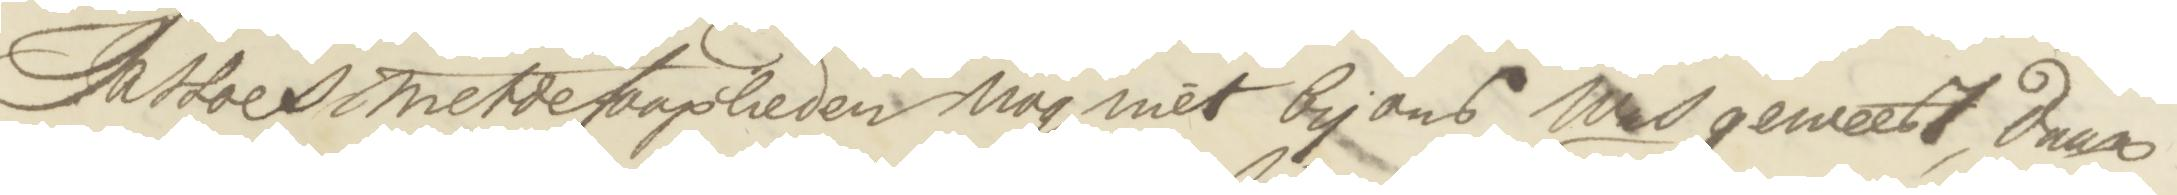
Iassoes met de Cooplieden nog niet bij ons was geweest, daar
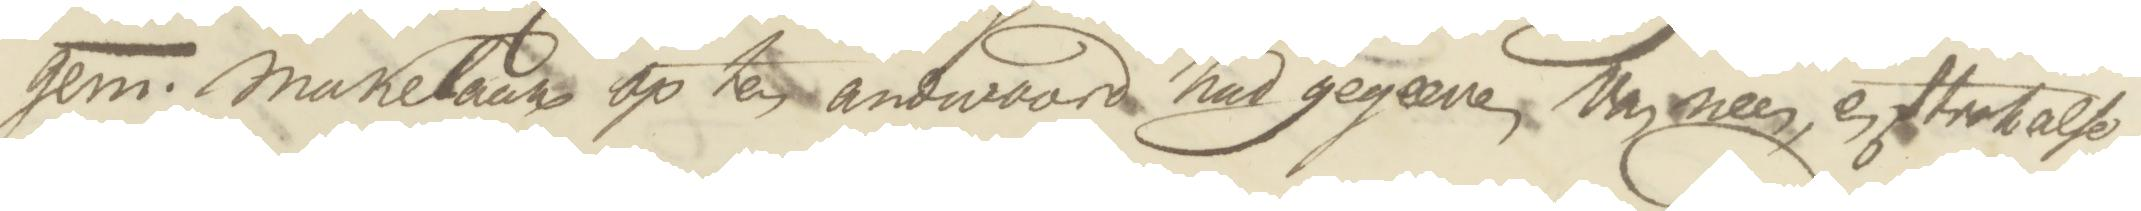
gem. makelaar op ten andwoord had gegeeven van neen, en vertrok alse
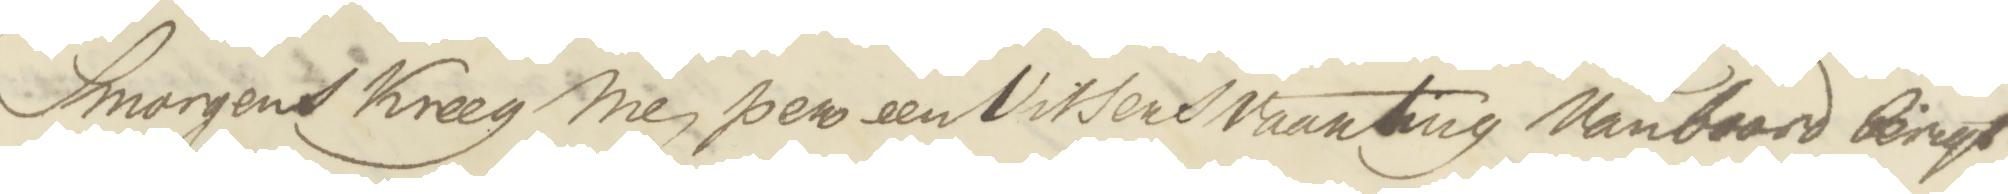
smorgens kreeg men per een vissers vaartuig vanboord berigt
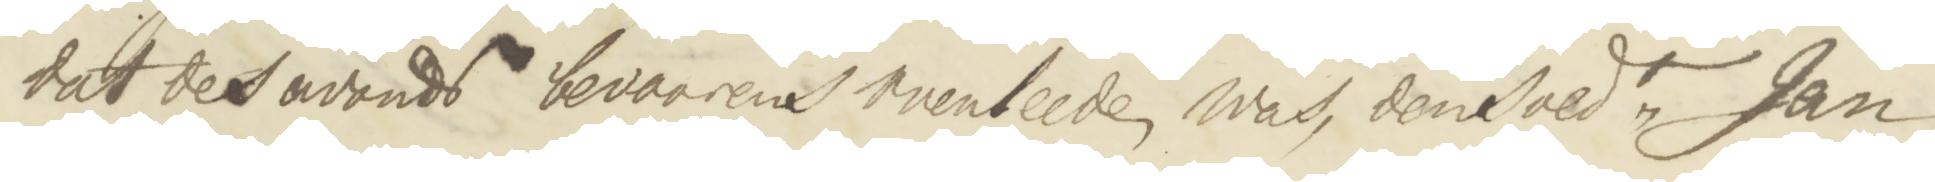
dat des avonds bevoorens overleeden was, den sold„t Jan
